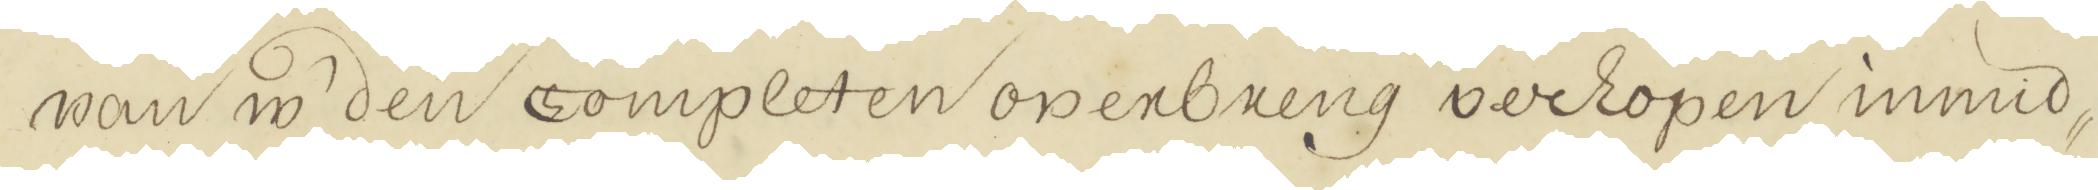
van w' den completen overbreng verhopen inmid„
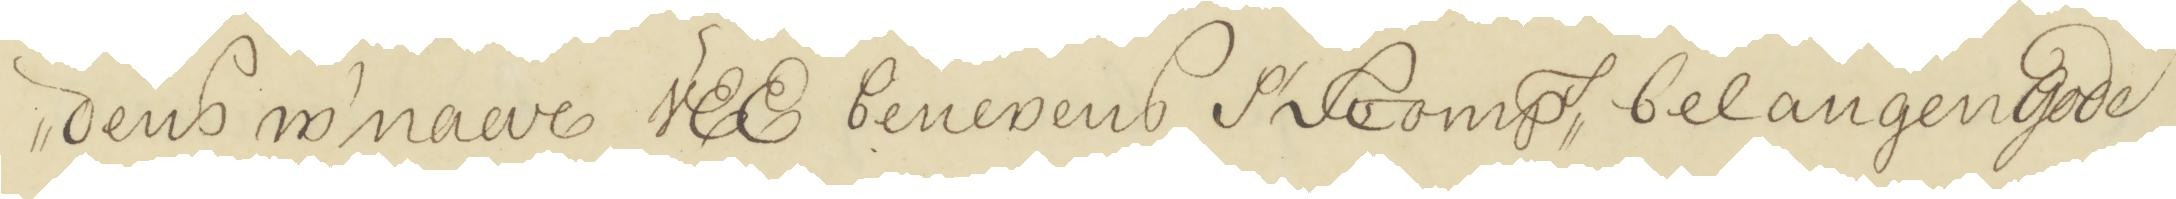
„dens w'naar VEE benevens s' Ecomp„s belangen gode
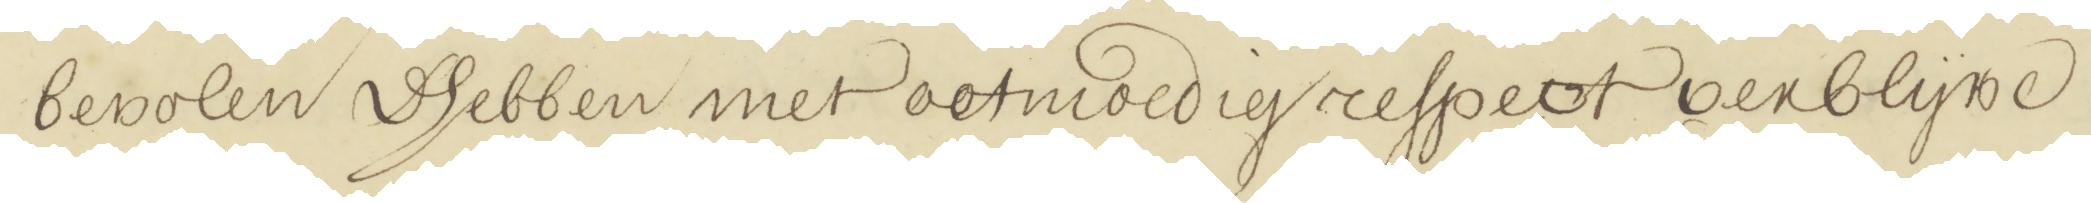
bevolen tehebben met oetmoedig respect verblijve
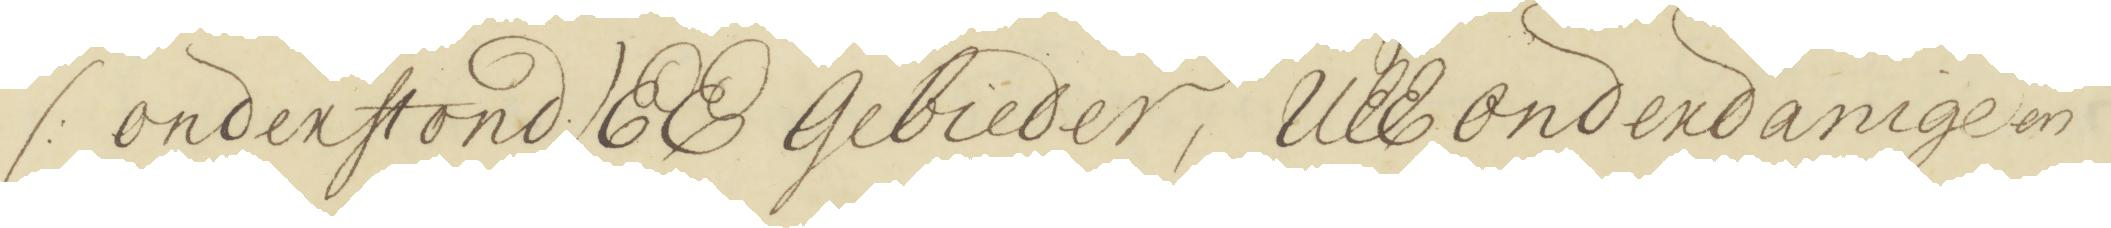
/: onderstond:/ EE Gebieder, UEE onderdanige en
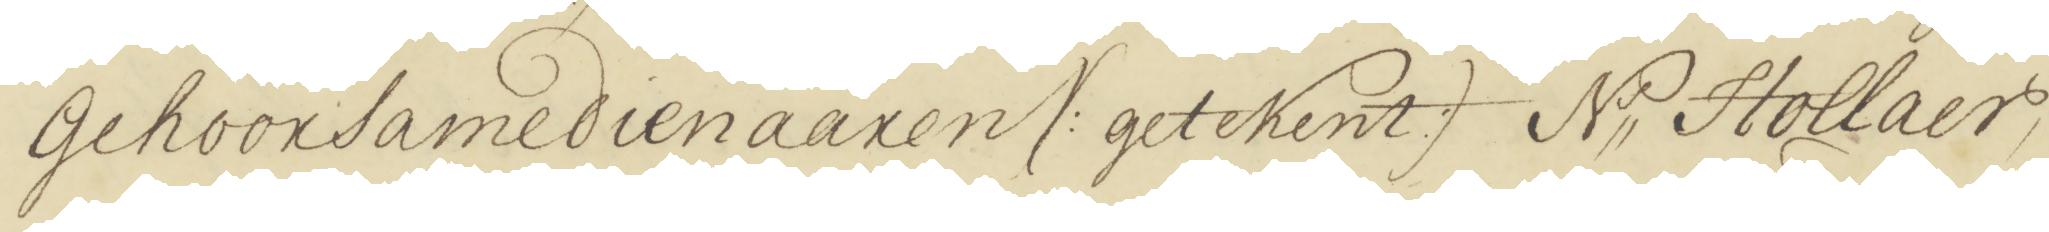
gehoorsame dienaaren /:getekent:/ N„s Hollaer,
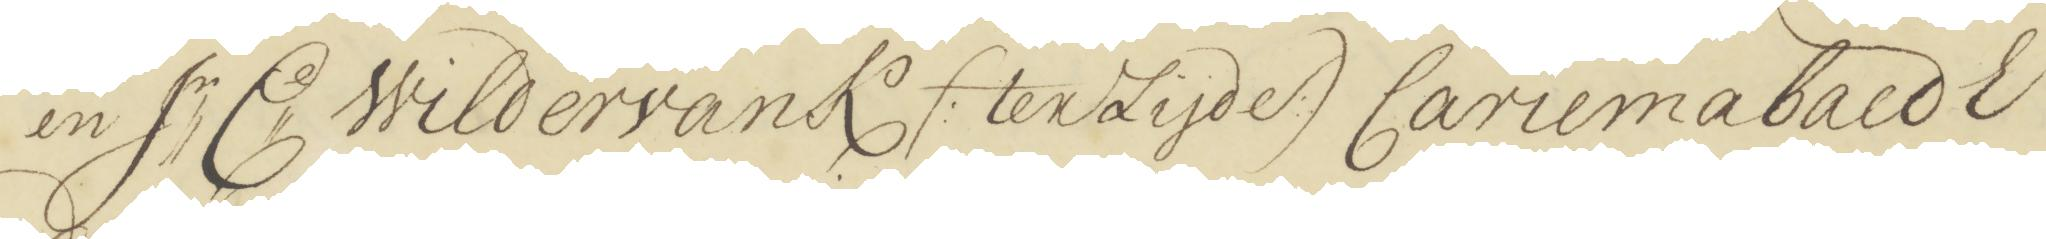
en J„n C„l Wildervank /: ter zijde:/ Cariemabaedh
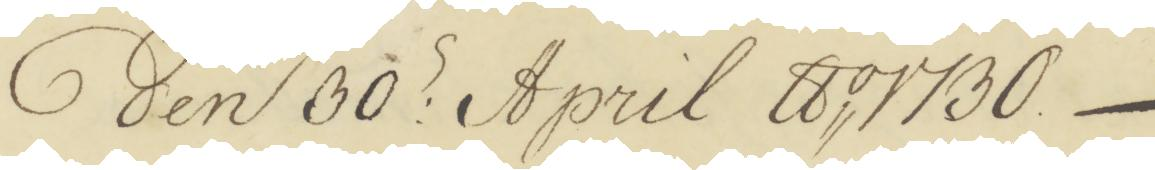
den 30:' April A„o 1730._
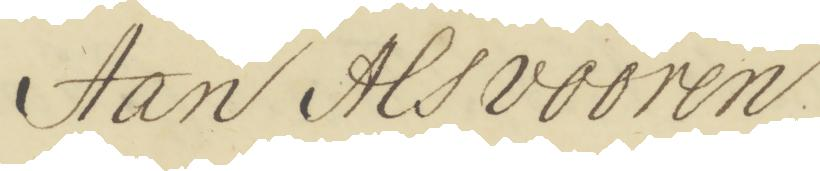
Aan Als vooren.
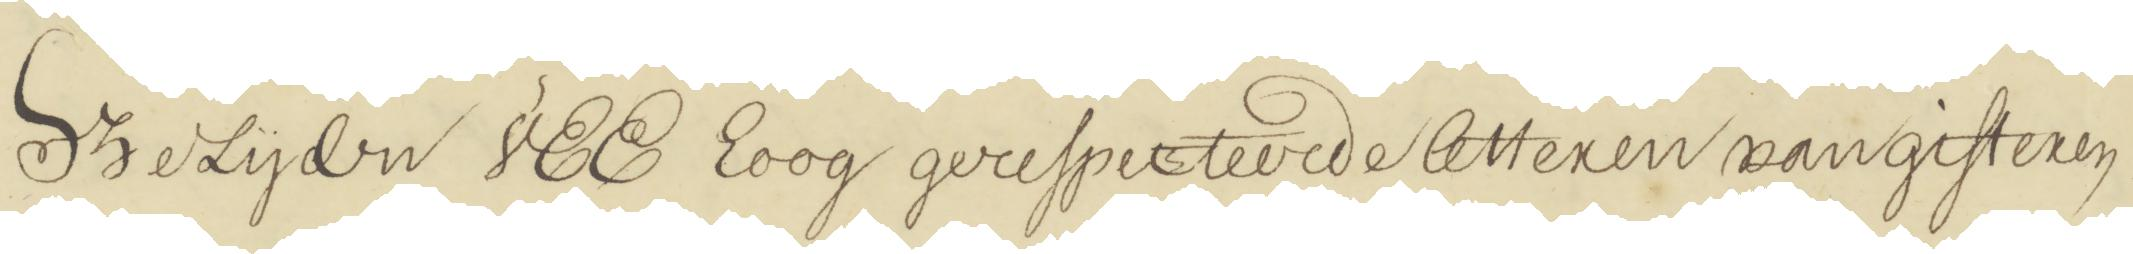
Bezijden VEE hoog gerespecteerde letteren van gisteren
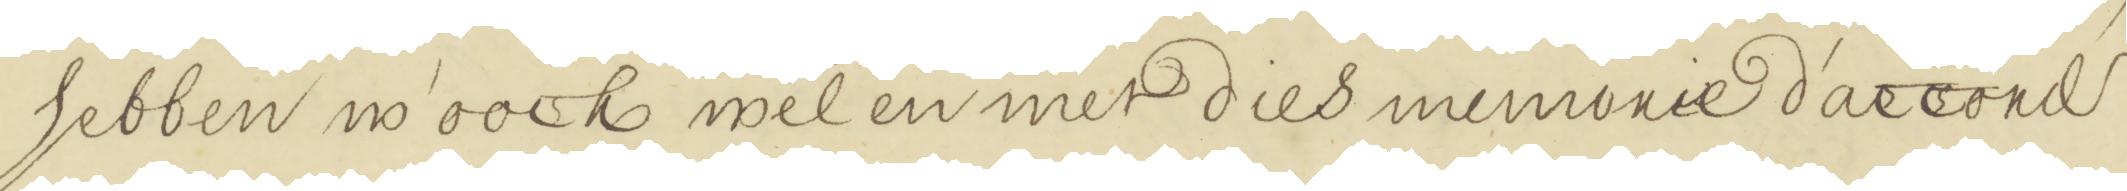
hebben w' oock wel en met dies memorie d’accord
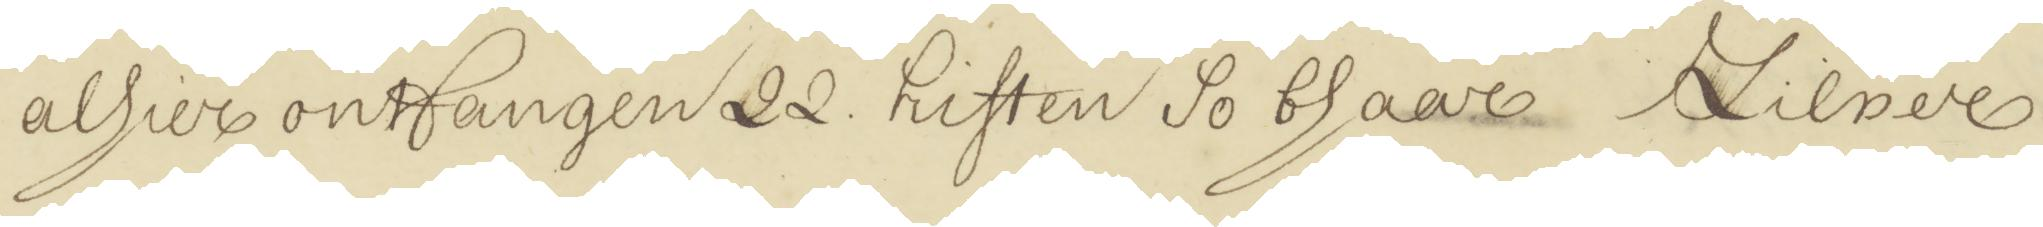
alhier ontfangen 22. kisten so bhaar Zilver
